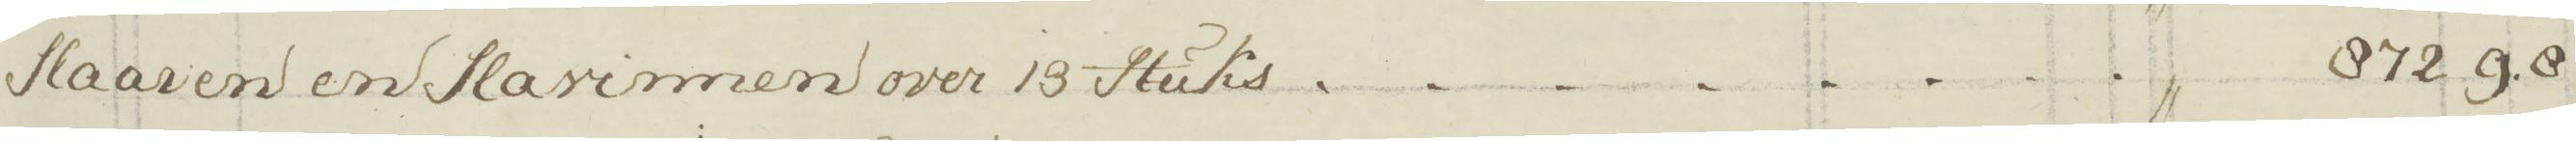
Slaaven en Slavinnen over 13 stuks - - - - - - - - „872. 9.8
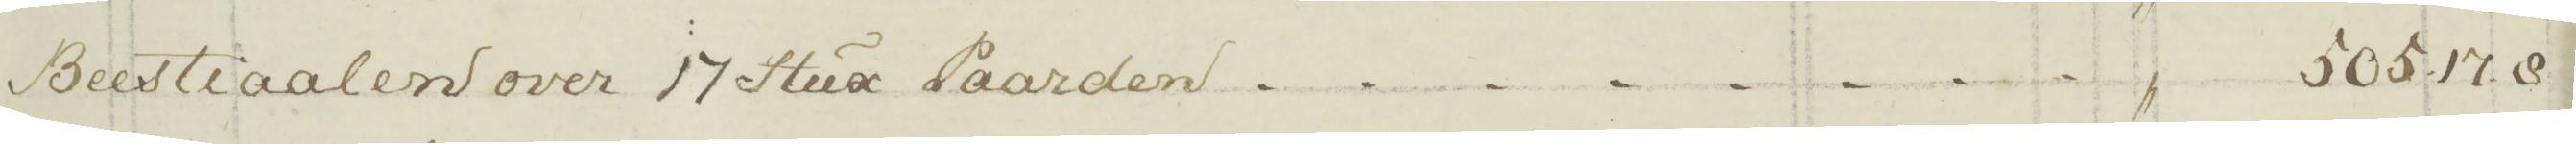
Beestiaalen over 17 stux Paarden - - - - - - - - „505.17.8
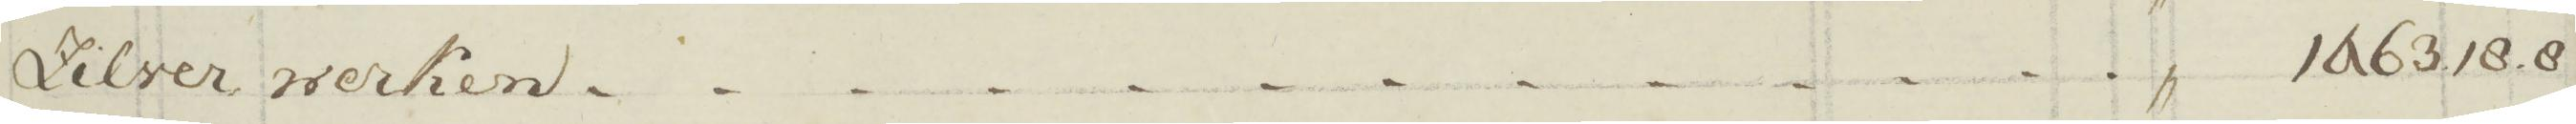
Zilver werken - - - - - - - - - - - - „1463.18.8
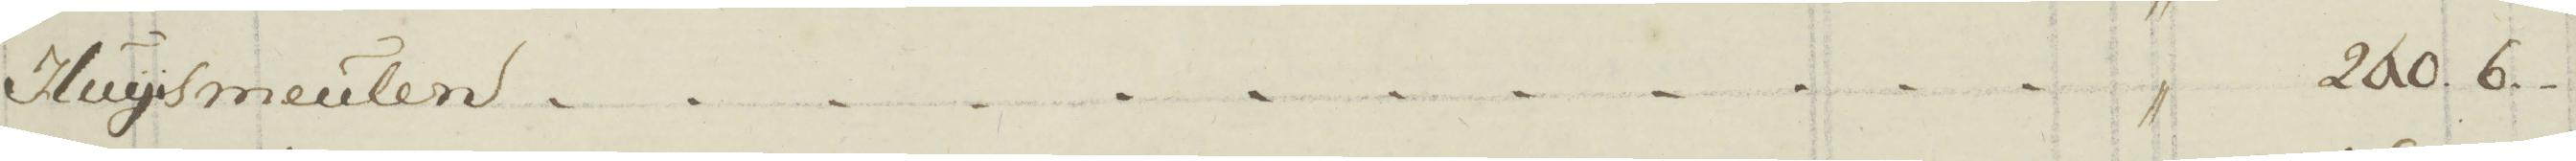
Huijsmeulen - - - - - - - - - - - - „240. 6.—
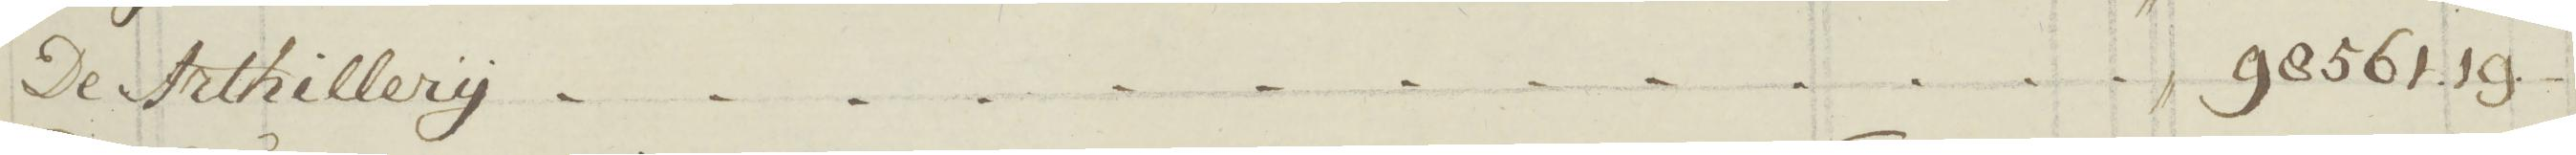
De Arthillerij - - - - - - - - - - - - - „98561.19.—
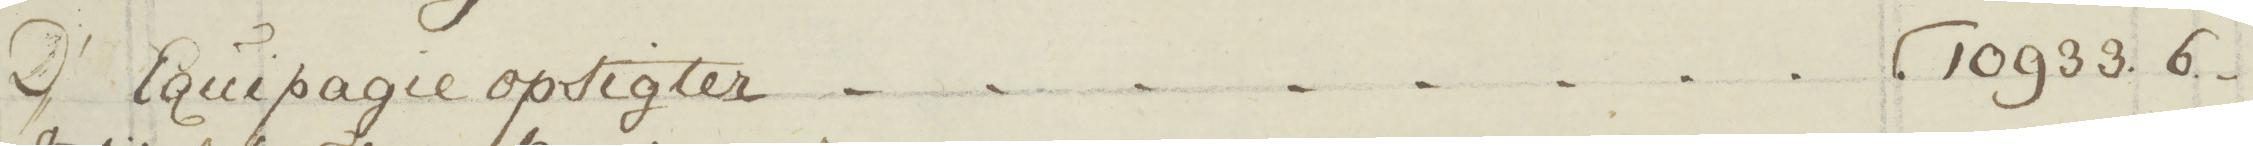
D' Equipagie opsigter - - - - - - - - ƒ10933. 6.—
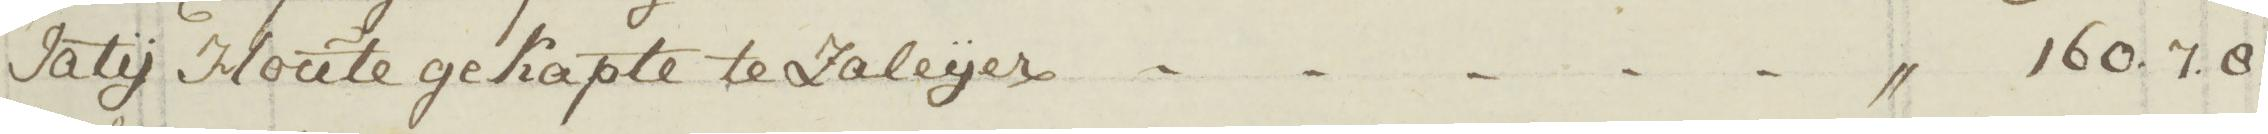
Jatij Houte gekapte te Zaleijer - - - - - „160. 7.8
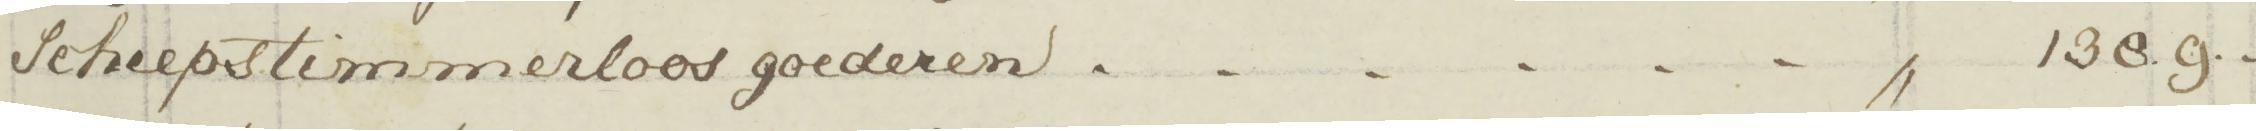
Scheepstimmerloos goederen - - - - - - „138:9:—
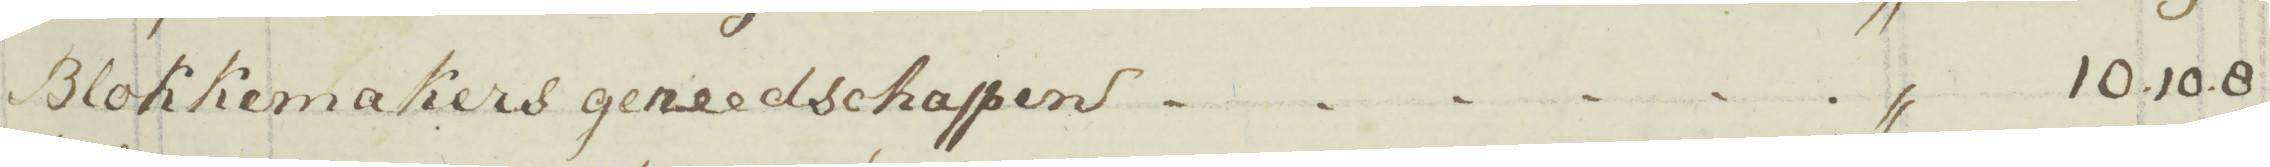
Blokkemakers gereedschappen - - - - - - „10.10.8
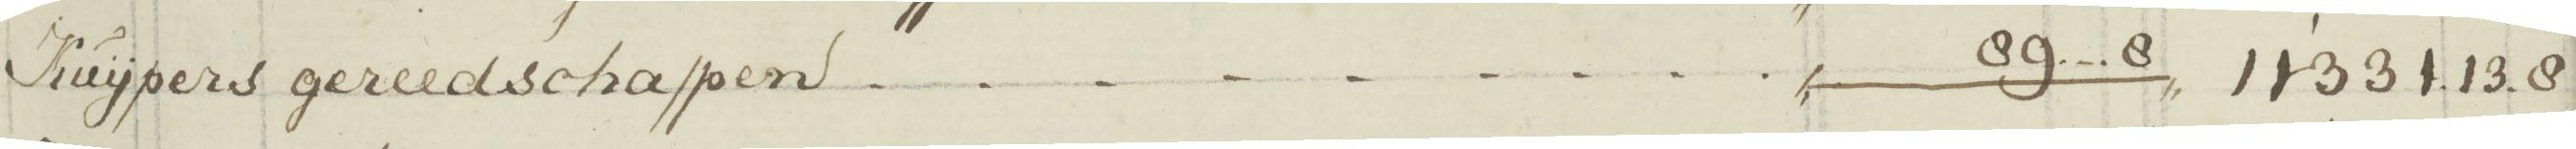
Kuijpers gereedschappen - - - - - - - - - „89.—.8 „11'331:13.8
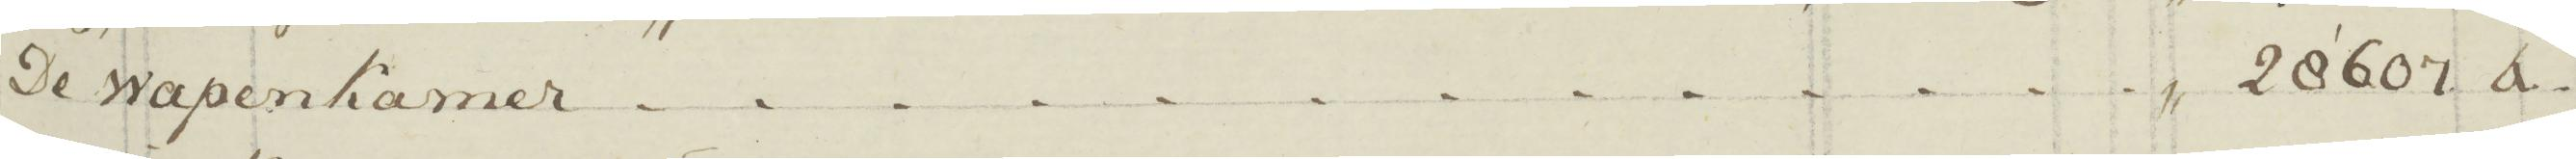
De wapenkamer - - - - - - - - - - - - - „28'607. 4.-
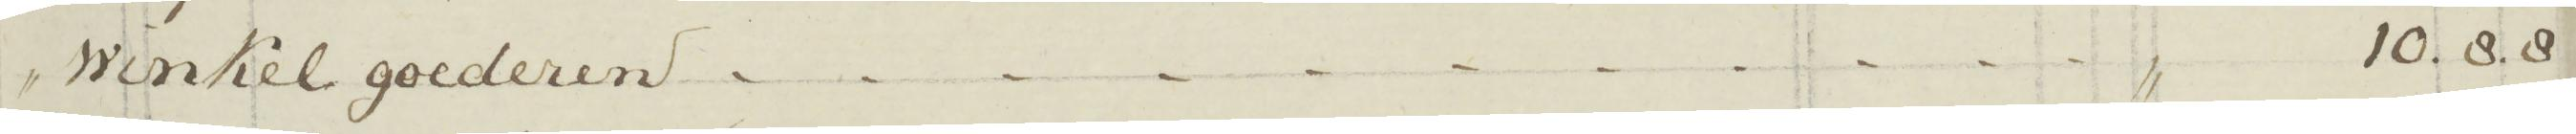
„Winkel goederen - - - - - - - - - - - „10. 8.8
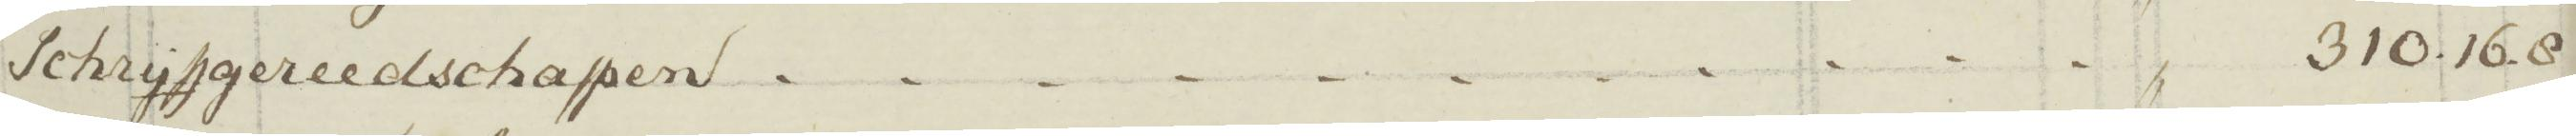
Schrijffgereedschappen - - - - - - - - - - - „310.16.8
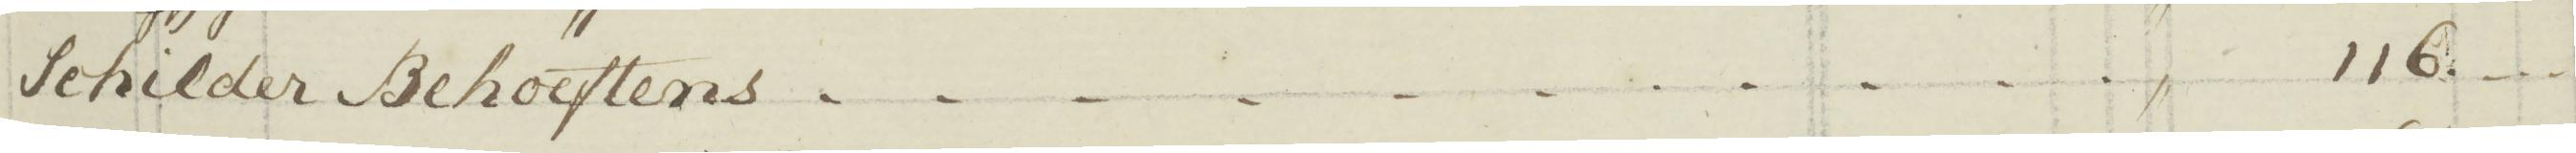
Schilder Behoeftens - - - - - - - - - - - „116.—.—
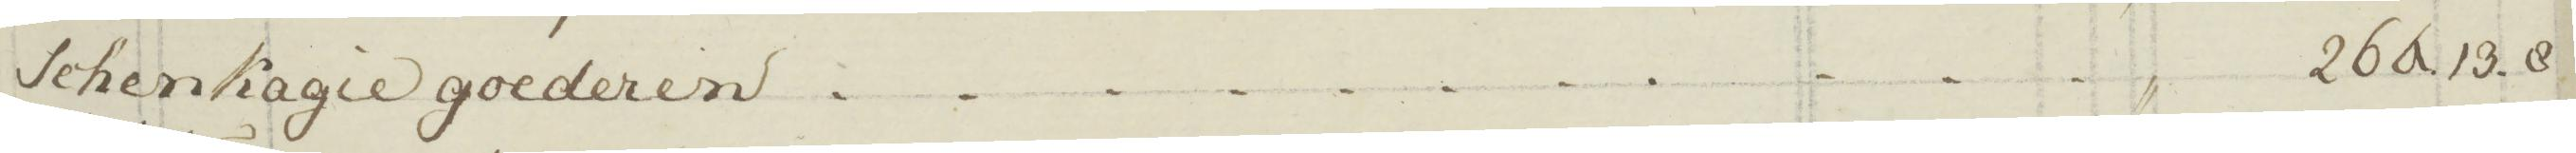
Schenkagie goederen - - - - - - - - - - - „264.13.8
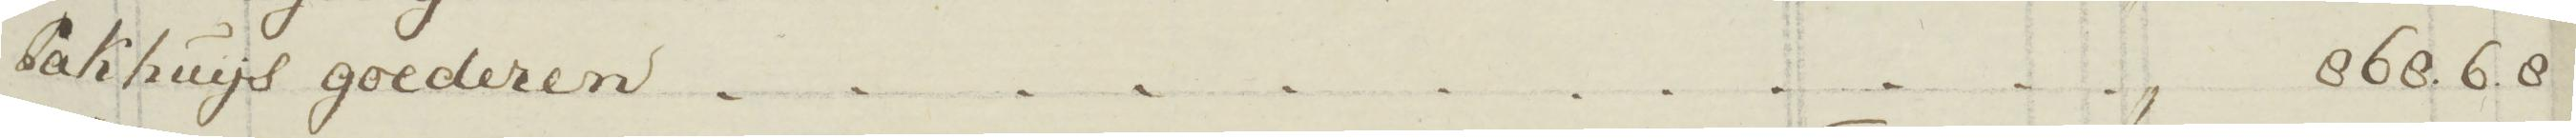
Pakhuijs goederen - - - - - - - - - - - - „868. 6. 8
